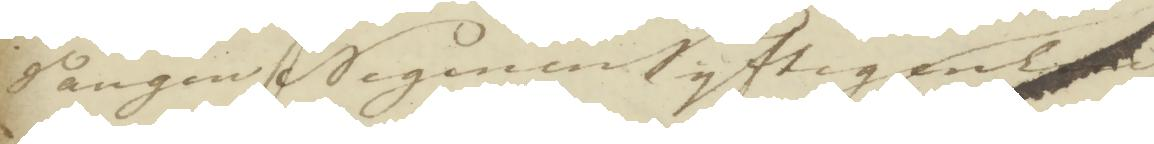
vangen NegenenVijftig enEen
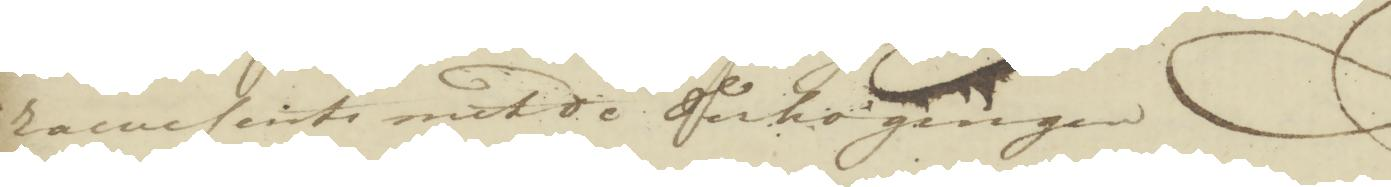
halve Cents met de Verhogingen
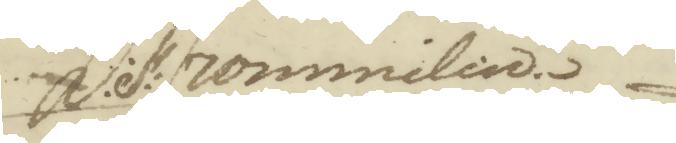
D:F: Crommelin.-
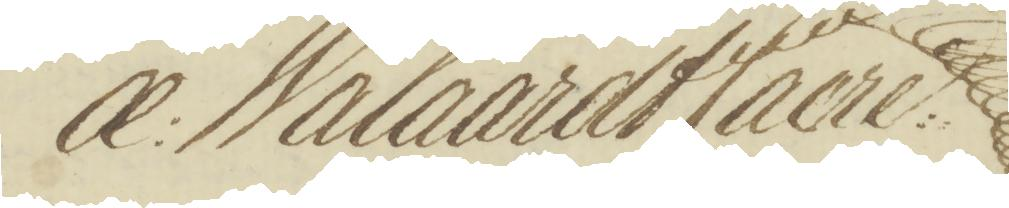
ae. Walaardt Sacre:
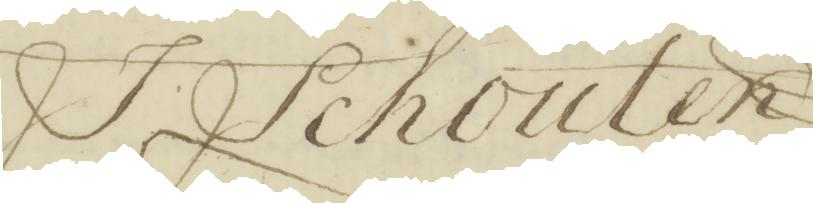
I. Schouten
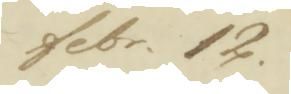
febr: 12.
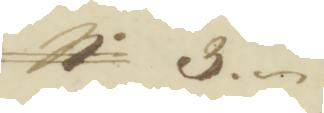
N=o 3. —
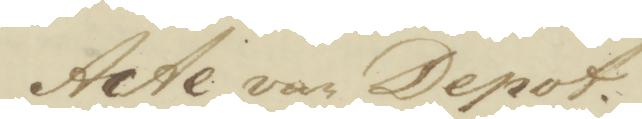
Acte van Depot.
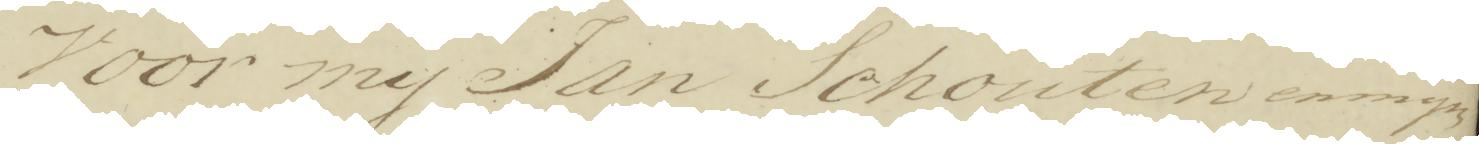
Voor mij Ian Schouten en myn
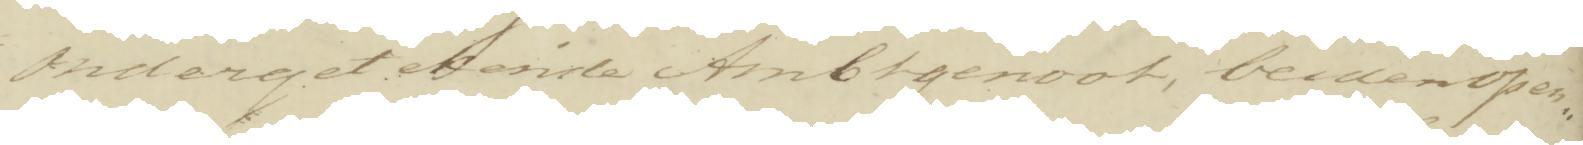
ondergetekende Ambtgenoot, beiden open„
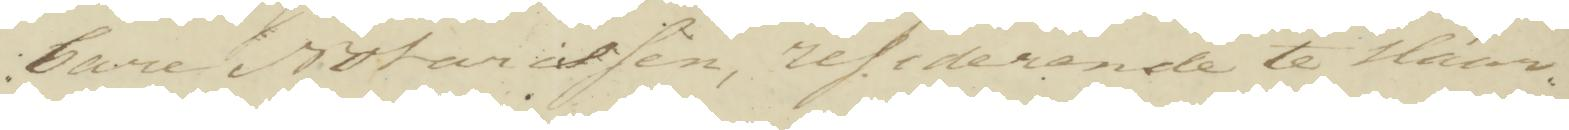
bare Notarissen, residerende te Haar„
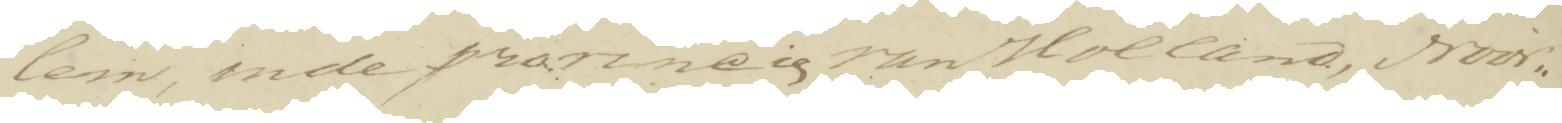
lem, inde provincie van Holland, Noor„
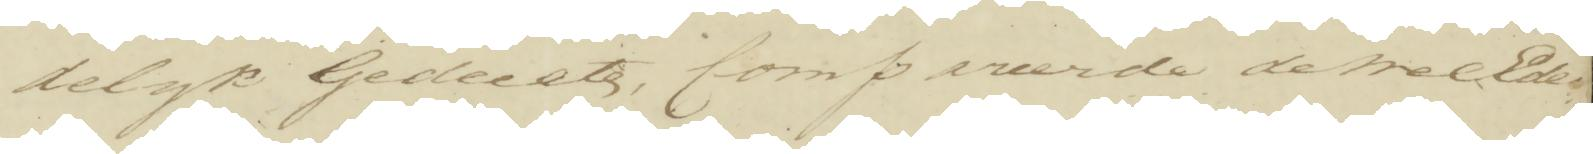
kelijk Gedeelte, Compareerde de wel Ede„
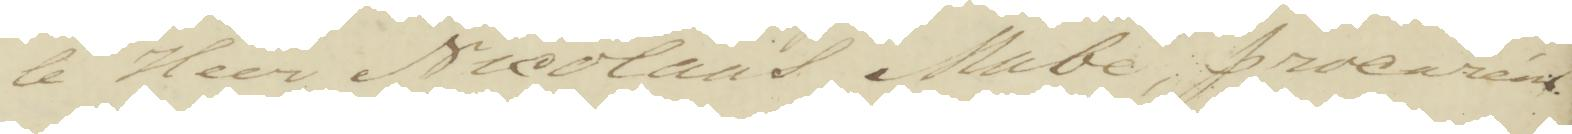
le Heer Nicolaas Mabe, procureur
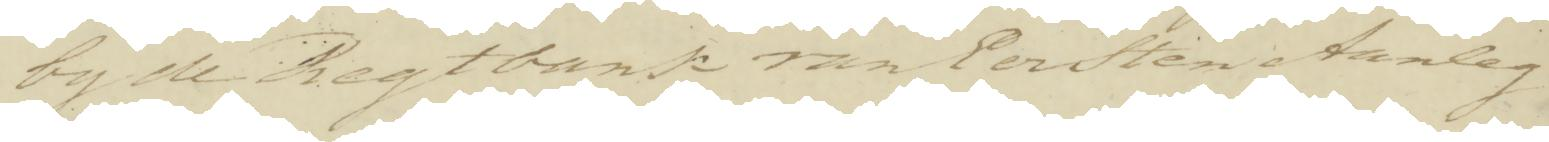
by de Regtbank van Eersten Aanleg
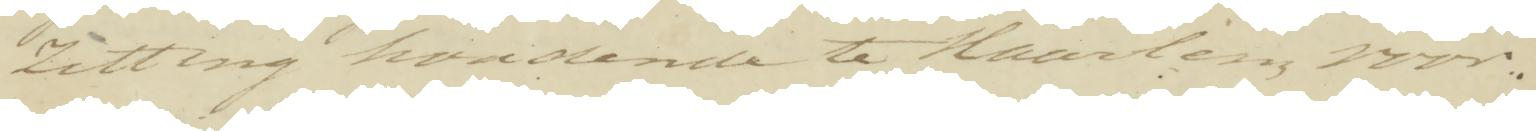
zitting houdende te Haarlem voor„
